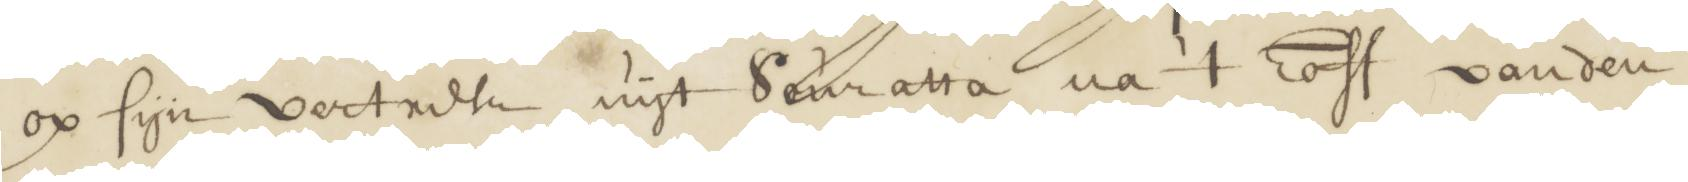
op sijn vertrek uijt Souratta na ’t hoff van den
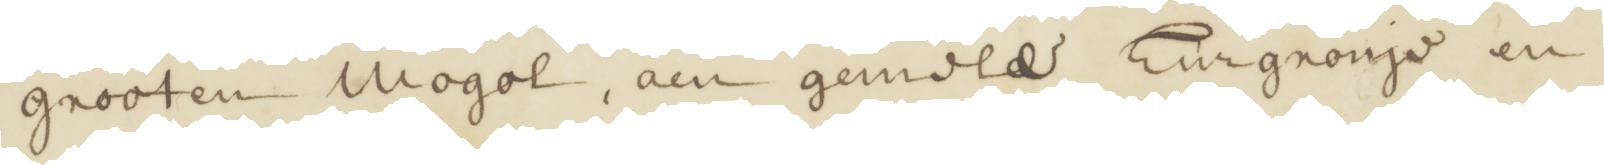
grooten mogol, aen gemelde hurgronje en
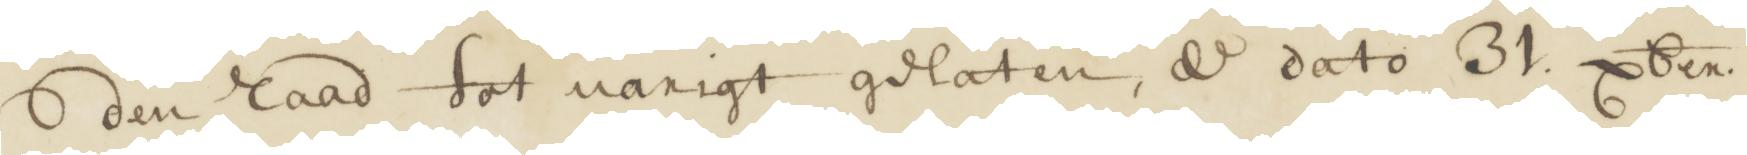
den Raad tot narigt gelaten, de dato 31. xber.
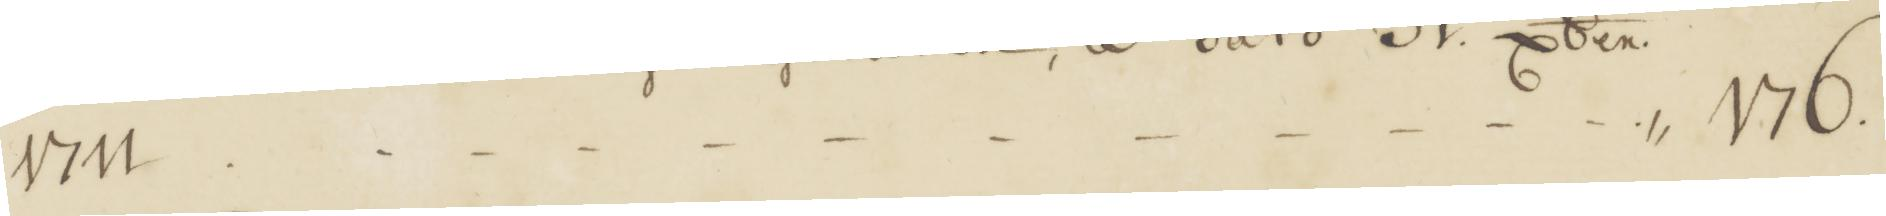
1711 . - - - - - - - - - - - . „ 176.
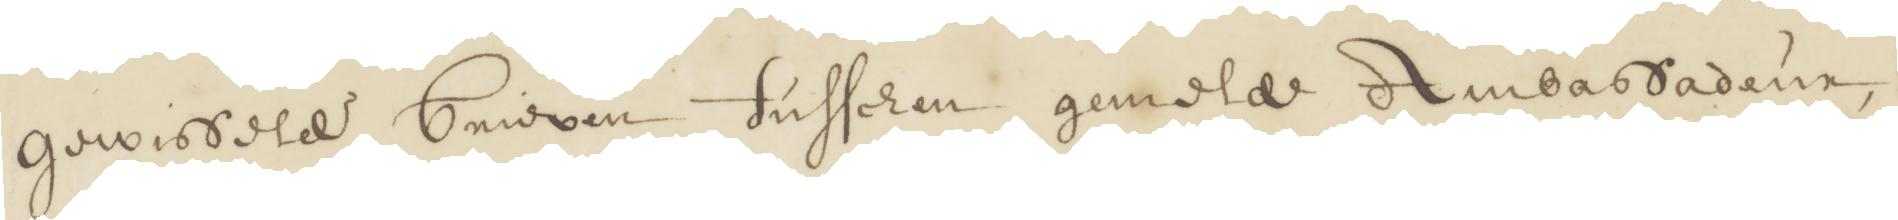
gewisselde brieven tusschen gemelde Ambassadeur,
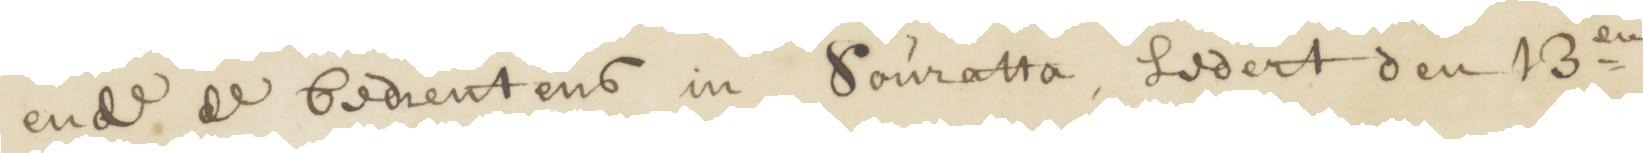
ende de bedientens in Souratta, sedert den 13=en
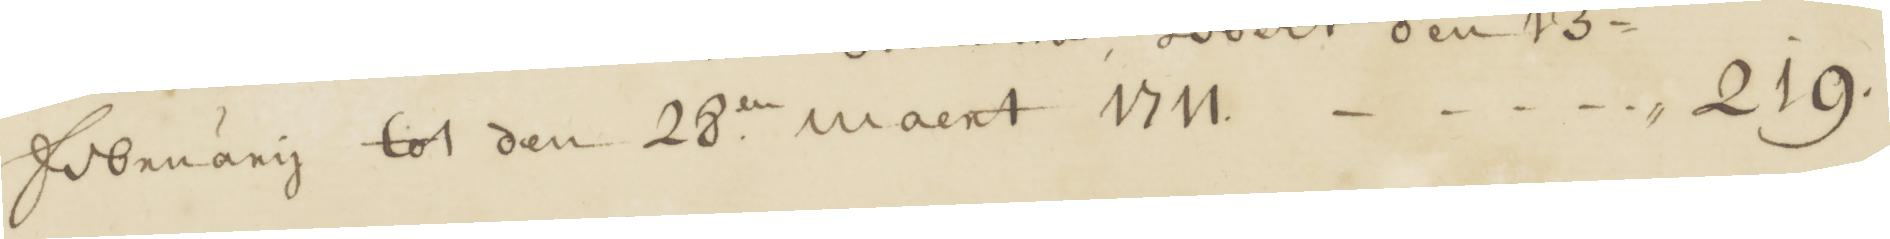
Februarij tot den 28.en maert 1711. - - - - - „ 219.
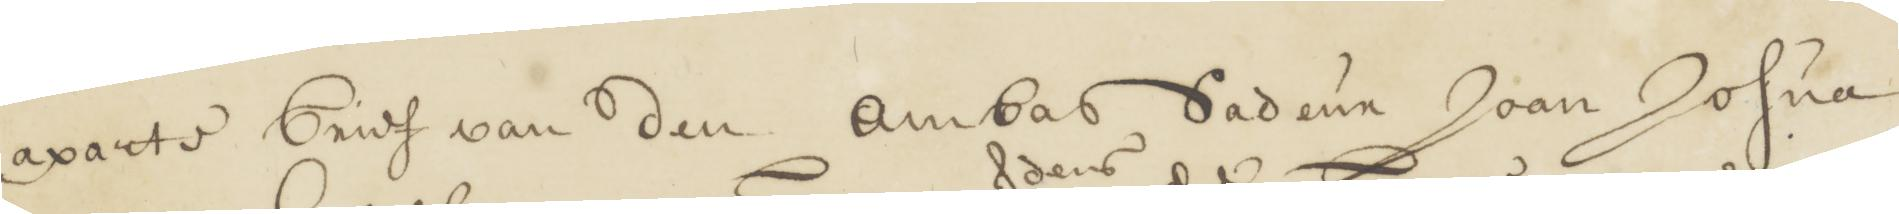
aparte brief van den Ambassadeur Joan Josua
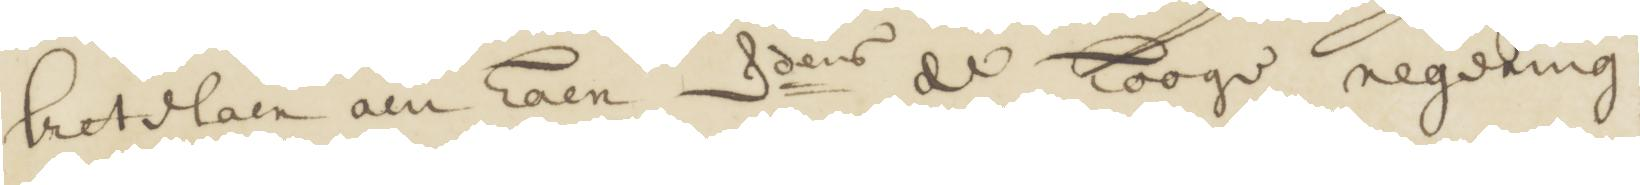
ketelaer aen haer E=dens de Hooge regering
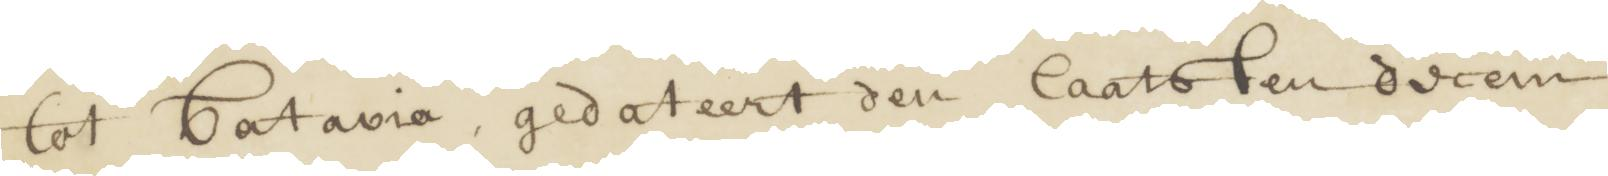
tot Batavia, gedateert den laatsten decem
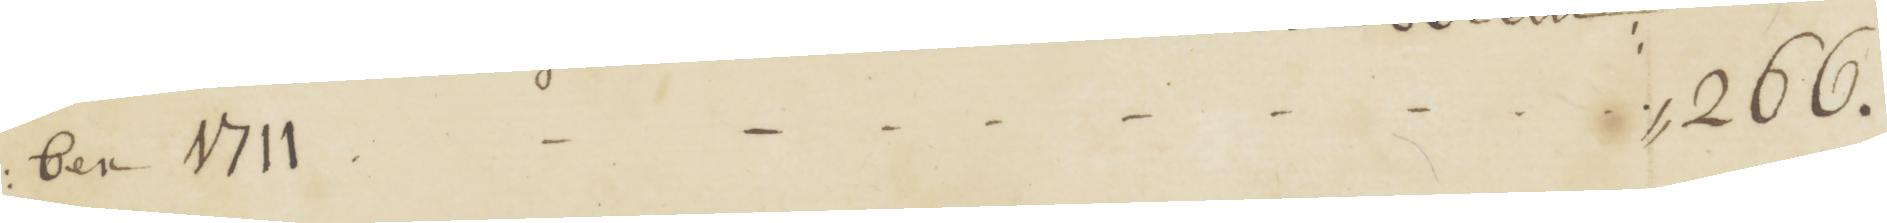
:ber 1711. - - - - - - - - - . „ 266.
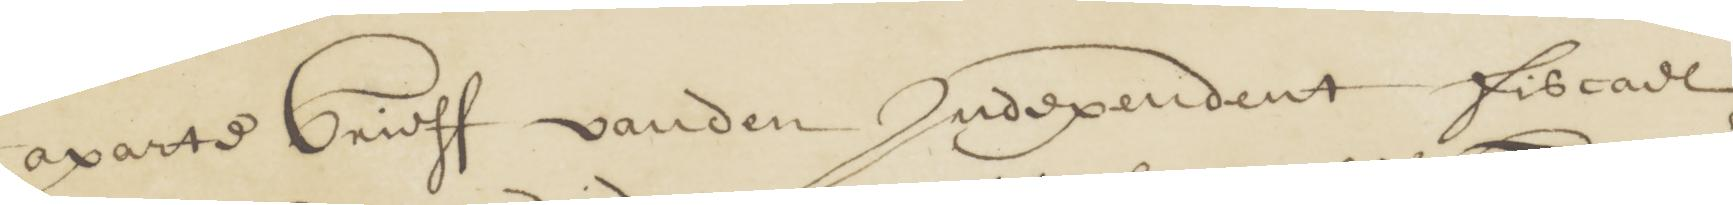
aparte Brieff vanden Jndependent fiscael
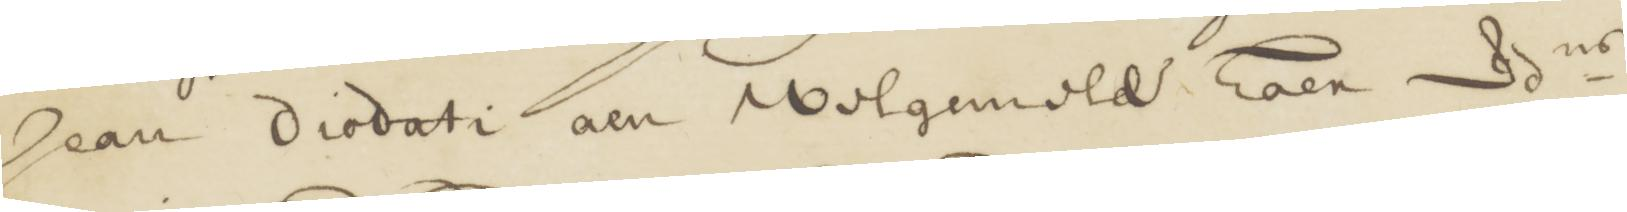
Jean diodati aen Welgemelde haer Ed=ns
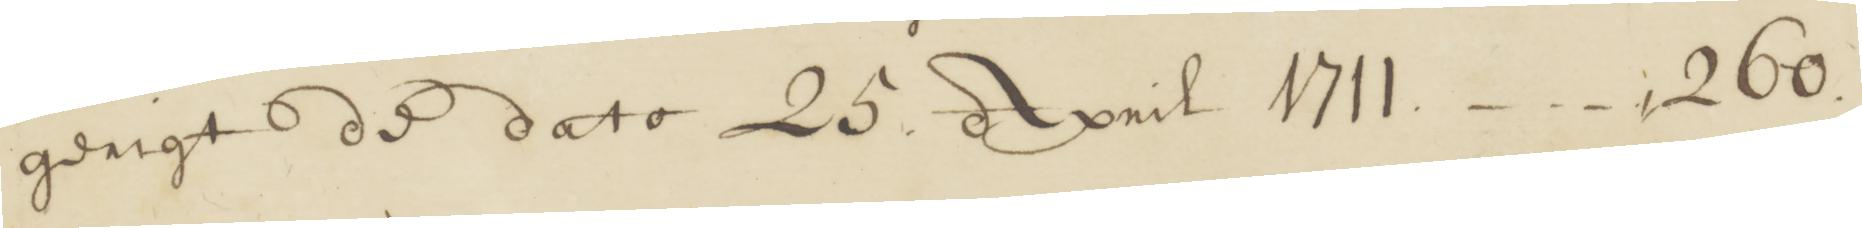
gerigt de dato 25. April 1711. - - - . „ 260.
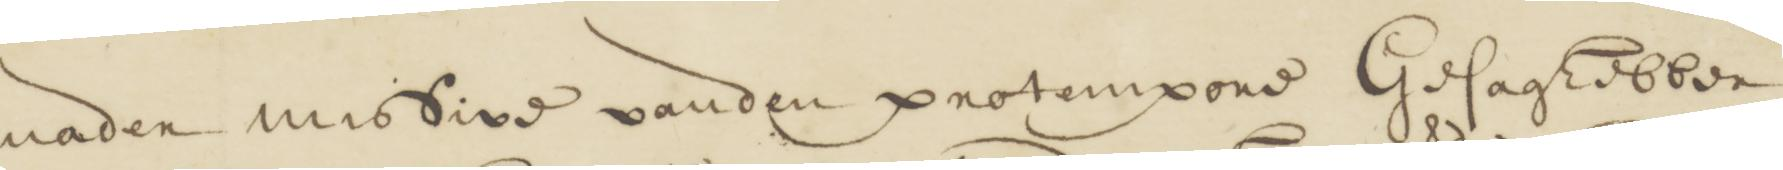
nader missive vanden protempore Gesaghebber
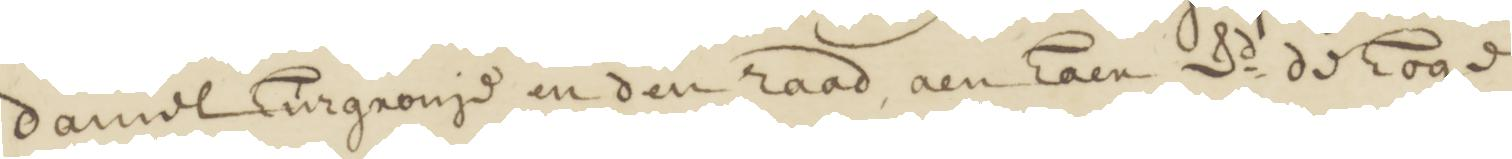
daniel hurgronje en den Raad, aen haer E:d dehoge
